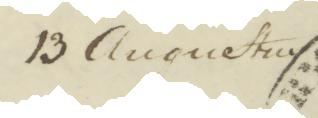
13 Augustus
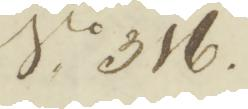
N„o 316.
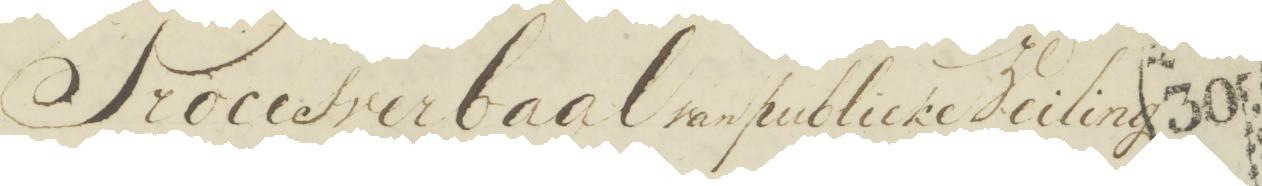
Procesverbaal van publieke Veiling
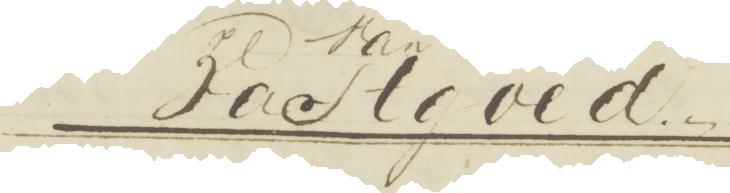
Vastgoed.
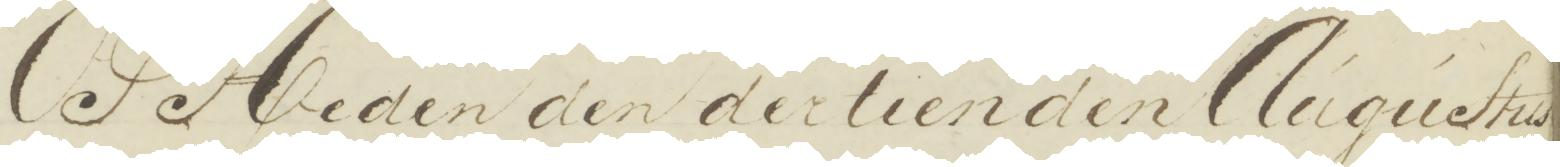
OP Heden den dertienden Augustus
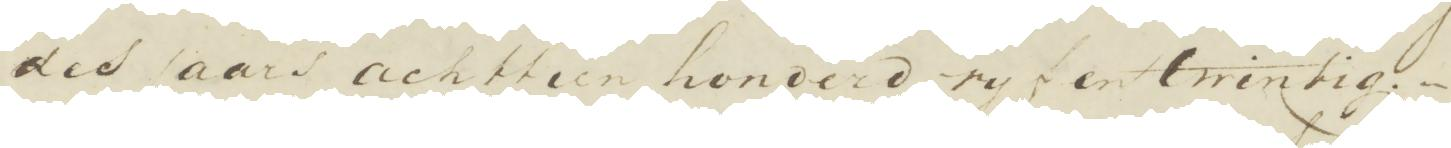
des jaars achttien honderd vyf en twintig.
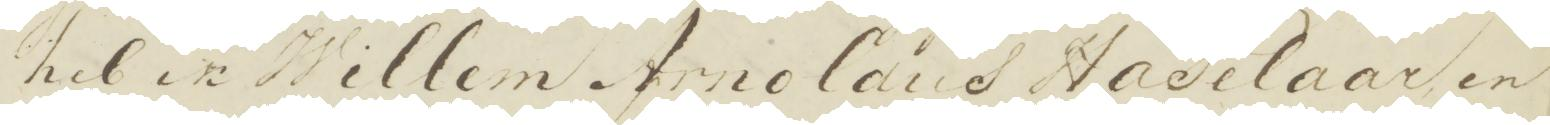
heb ik Willem Arnoldus Haselaar, en
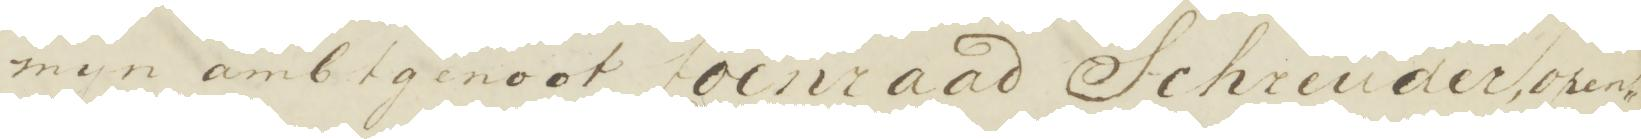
myn ambtgenoot Coenraad Schreuder, open„
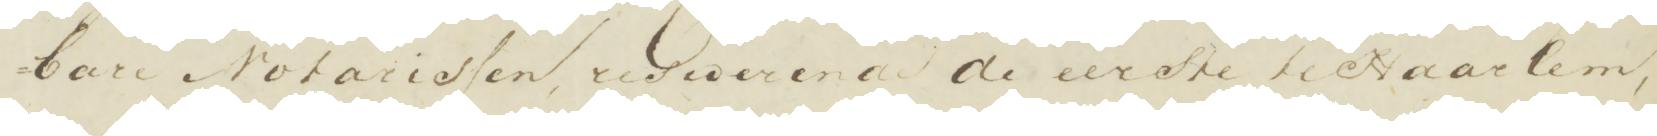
=bare Notarissen, residerende de eerste te Haarlem,
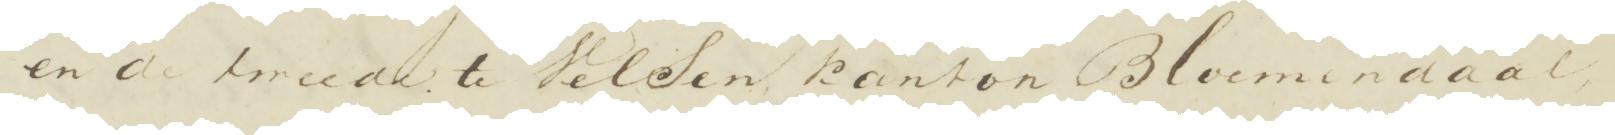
en de tweede te Velsen kanton Bloemendaal,
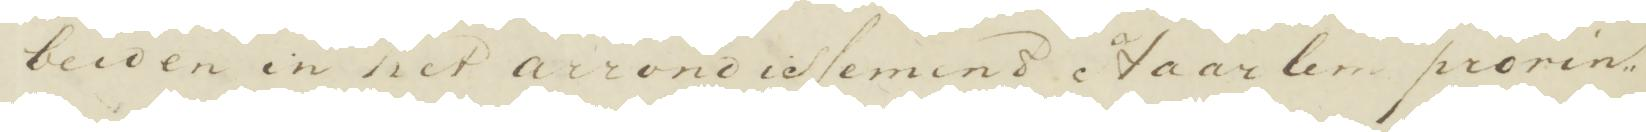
beiden in het arrondissement Haarlem provin„
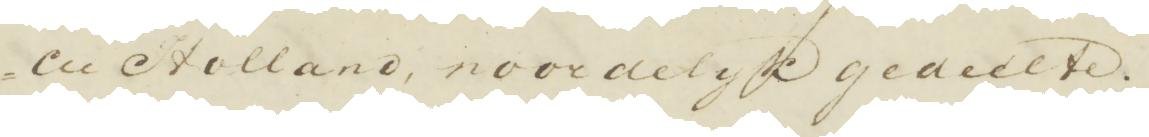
„cie Holland, noordelyk gedeelte.
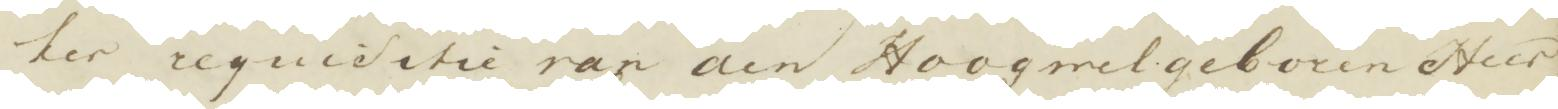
ter requisitie van den Hoogwelgeboren Heer
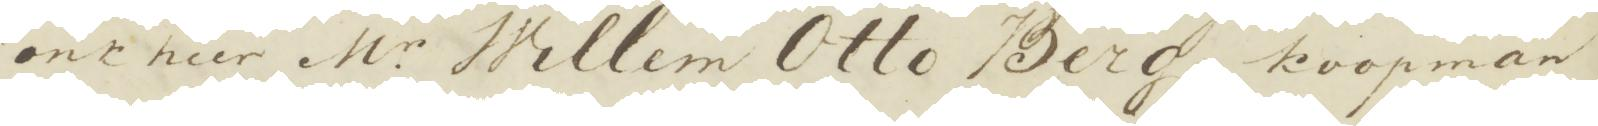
Jonk heer M.r Willem Otto Berg, koopman
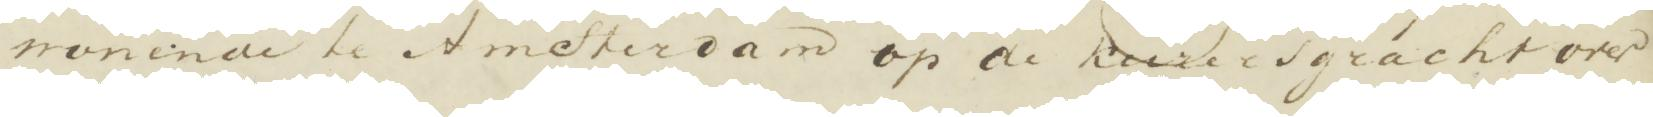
wonende te Amsterdam op de keizersgracht over
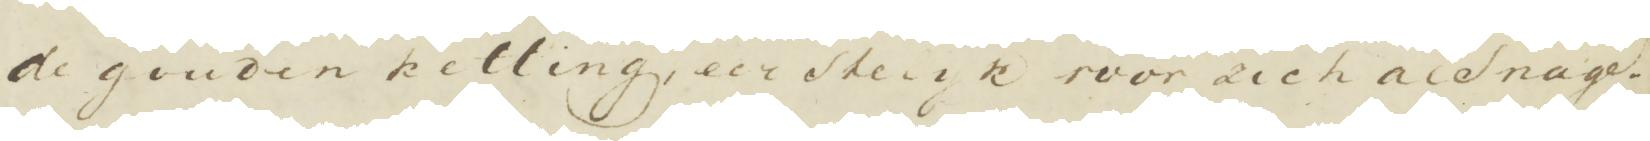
de gouden ketting, eerstelyk voor zich als nage=
